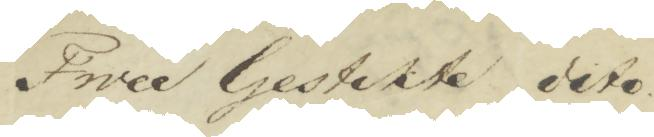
Twee Gestikte dito
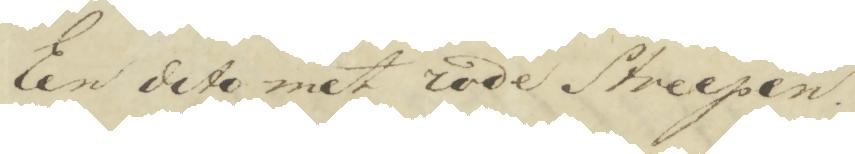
Een dito met rode streepen.
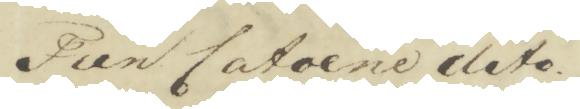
Tien Catoene dito.
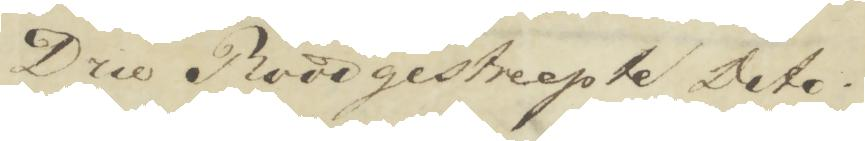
Drie Roodgestreepte Dito.
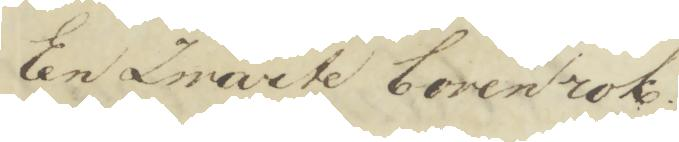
Een zwarte bovenrok.
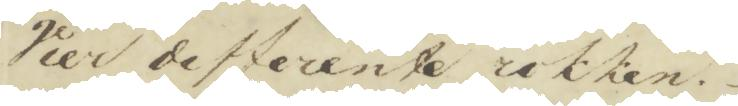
Vier differente rokken.
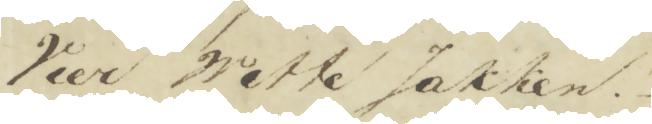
Vier Witte Jakken.
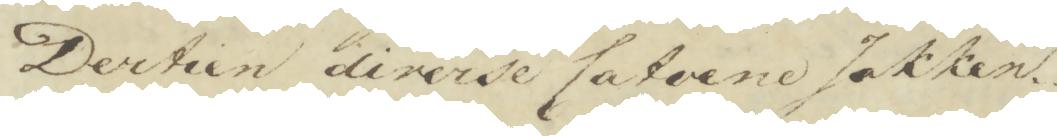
Dertien diverse Catoene Jakken.
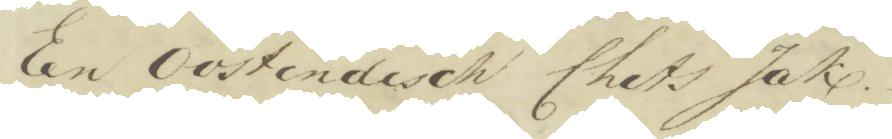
Een Oostindisch Chits Jak.
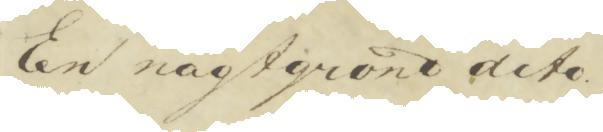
Een nagtgrond dito.
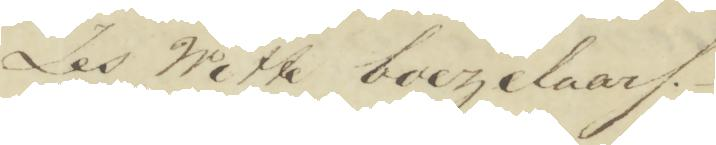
Zes Witte boezelaars.
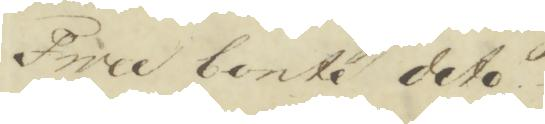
Twee bonte dito.
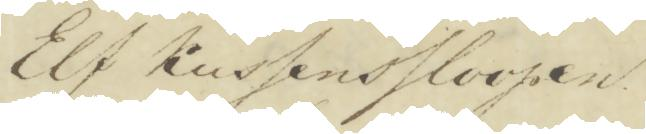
Elf kussenssloopen.
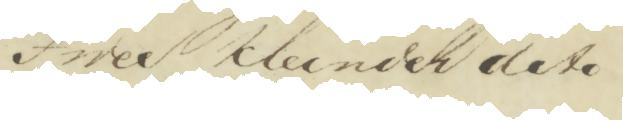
Twee kleinder dito
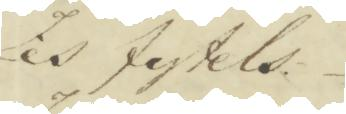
Zes fytels. —
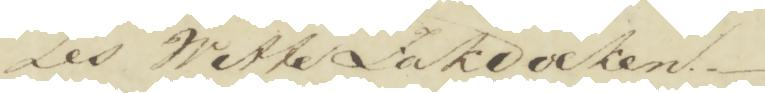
Zes Witte zakdoeken. —
